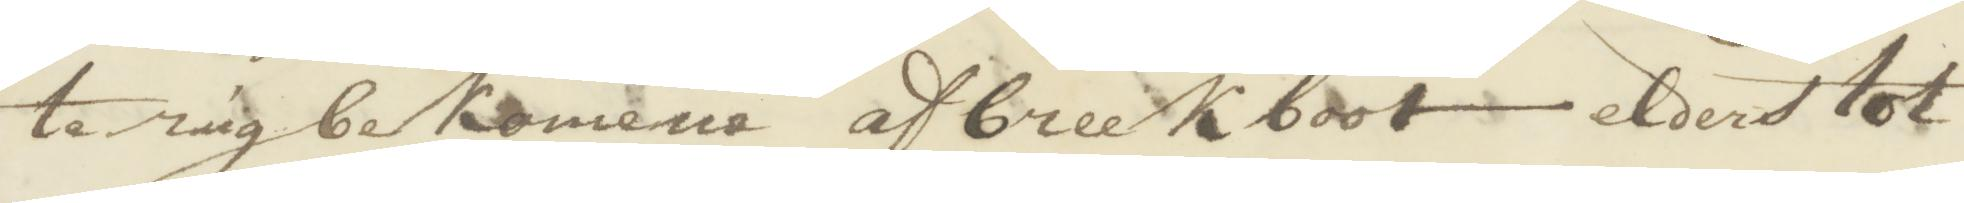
te rug bekomene afbreekboot elders tot
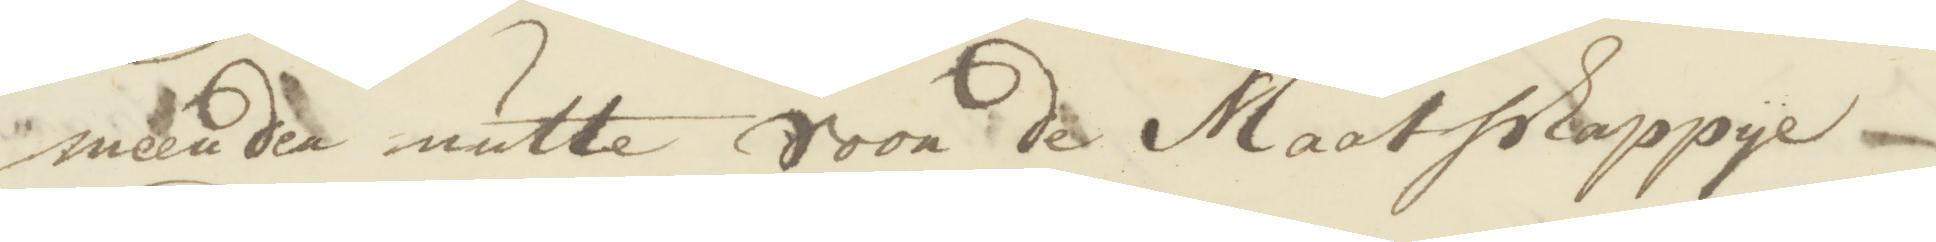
meerder nutte voor de Maatschappije
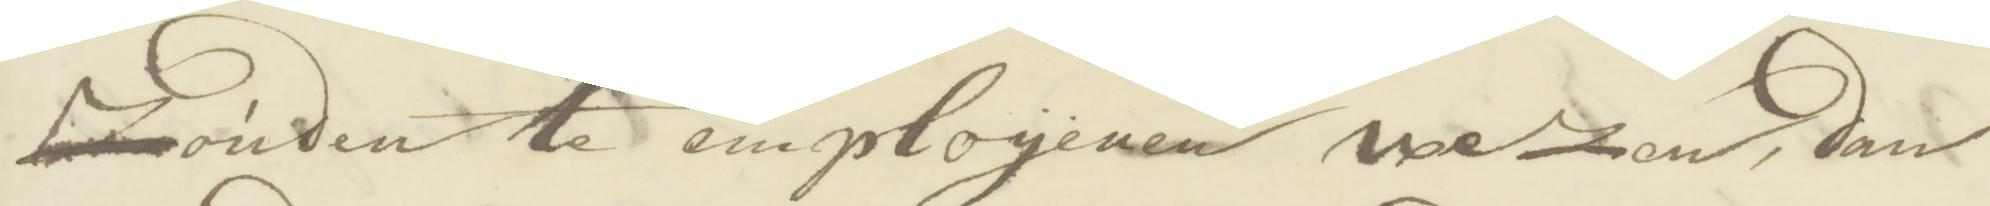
Zouden te emploijeren wezen, dan
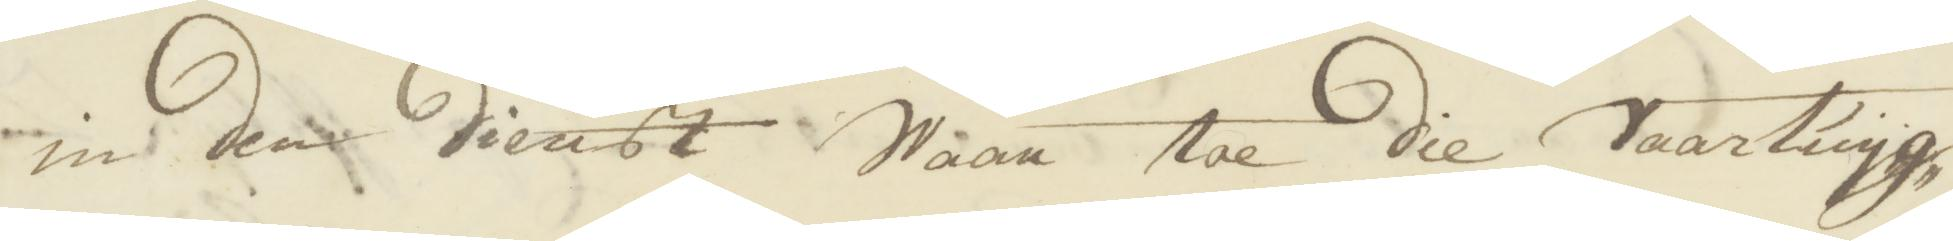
in den dienst waar toe die vaartuijg„
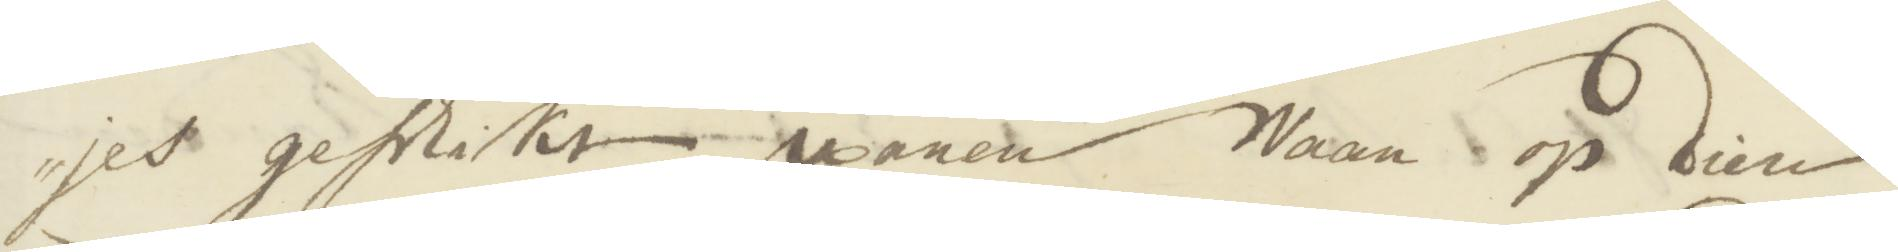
„jes geschikt waren waar op dien
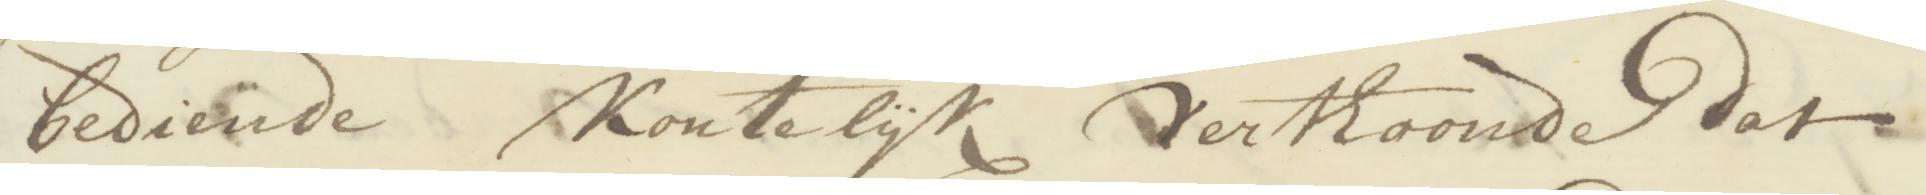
bediende kortelijk verthoonde dat
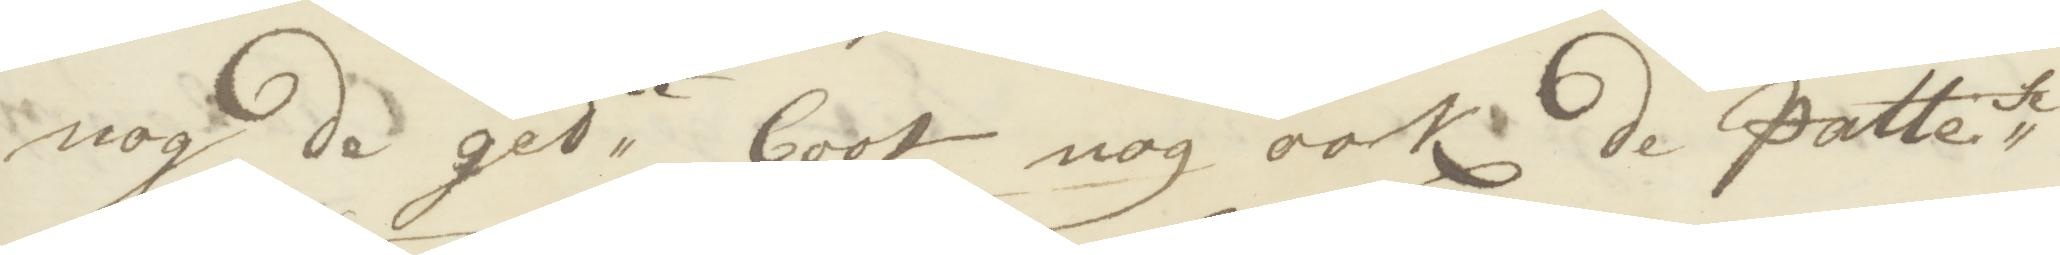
nog de ged„te boot nog ook de patte„se
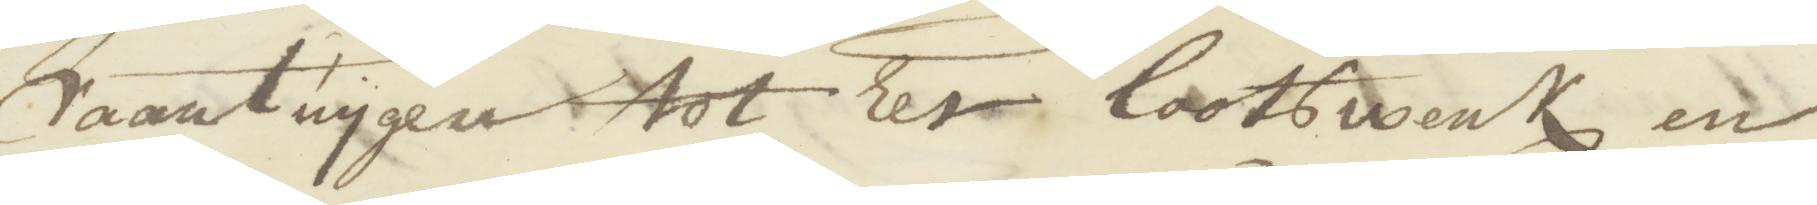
vaartuijgen tot het lootswerk en
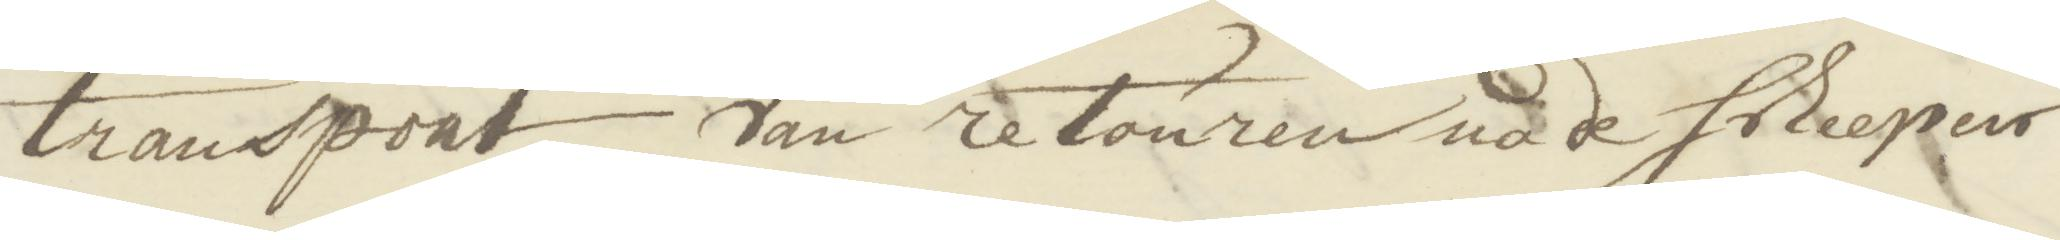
transport van retouren na de scheeper
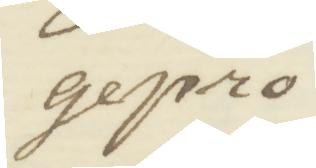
gepro
